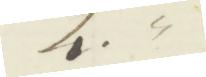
4. „
